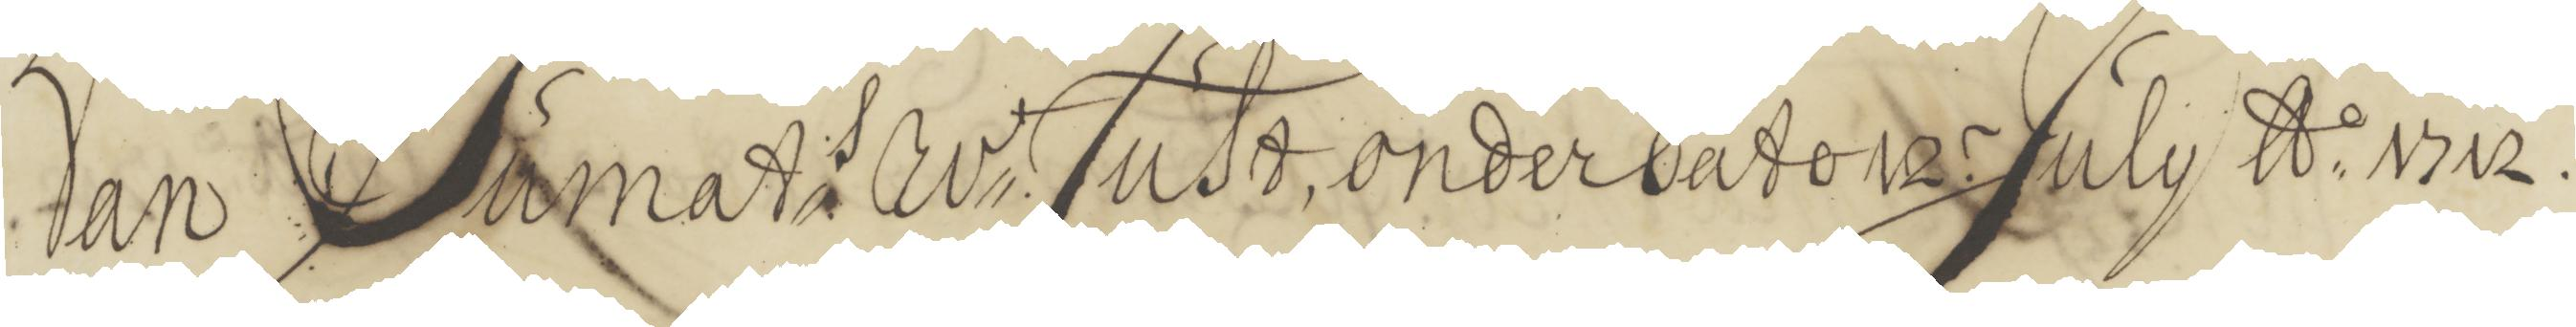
Van Sumat„s W„t Cust, onder dato 12.' Julij A„o 1712.
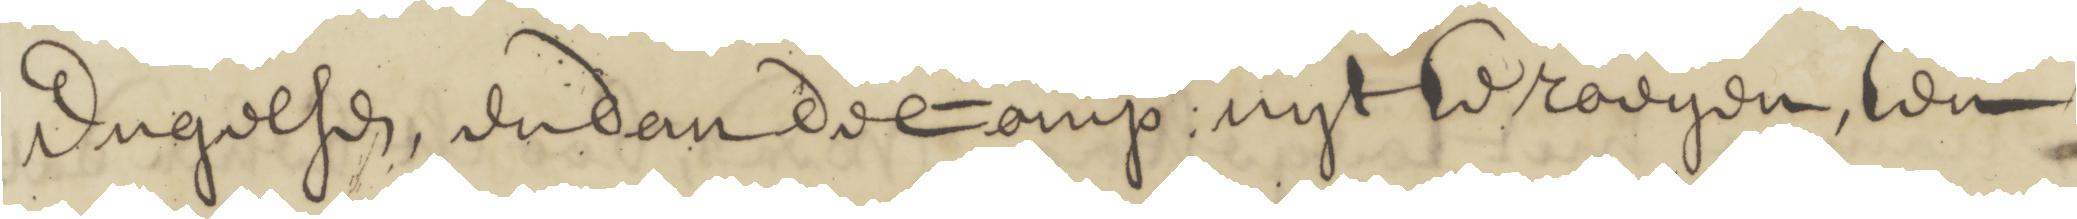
Engelsen, en dan de comp:e uijt te roeijen, ten
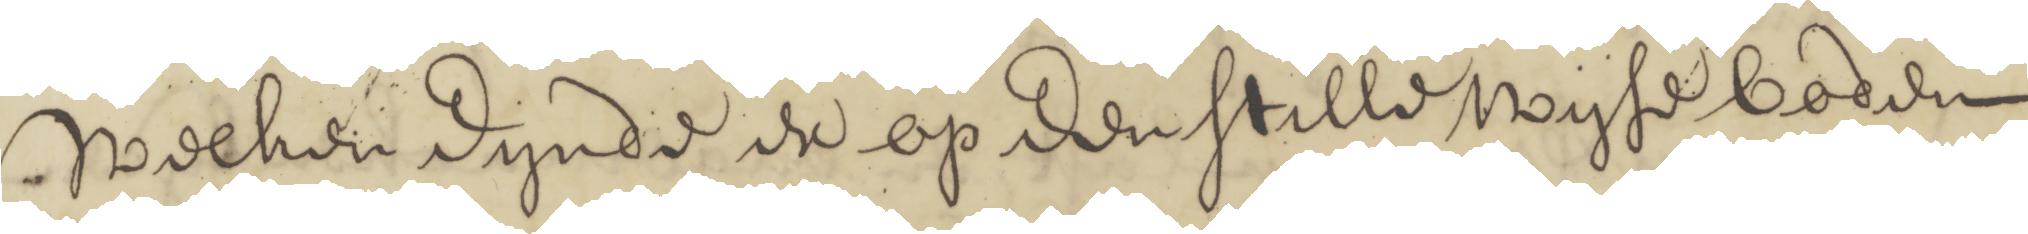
welken Eijnde er op Een stille wijse boden
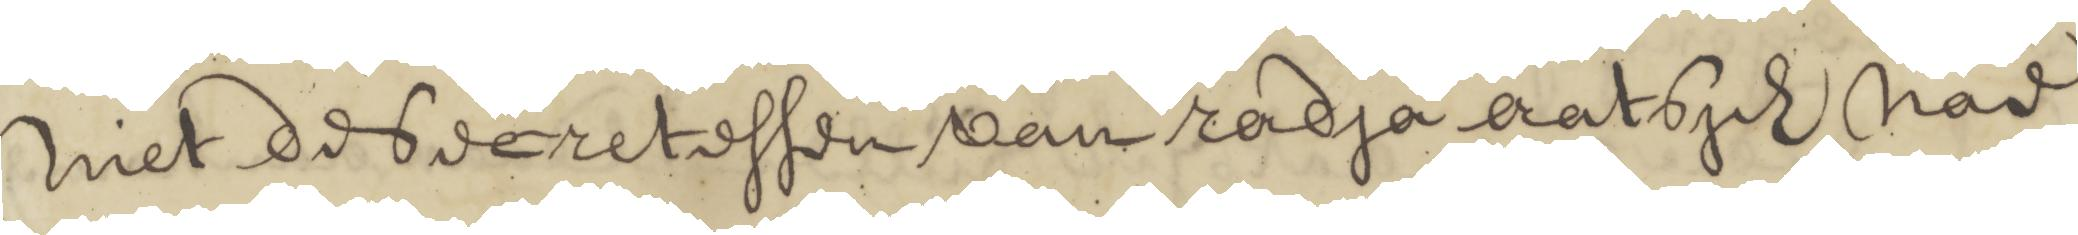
niet de secretessen van radja aatsjch nae
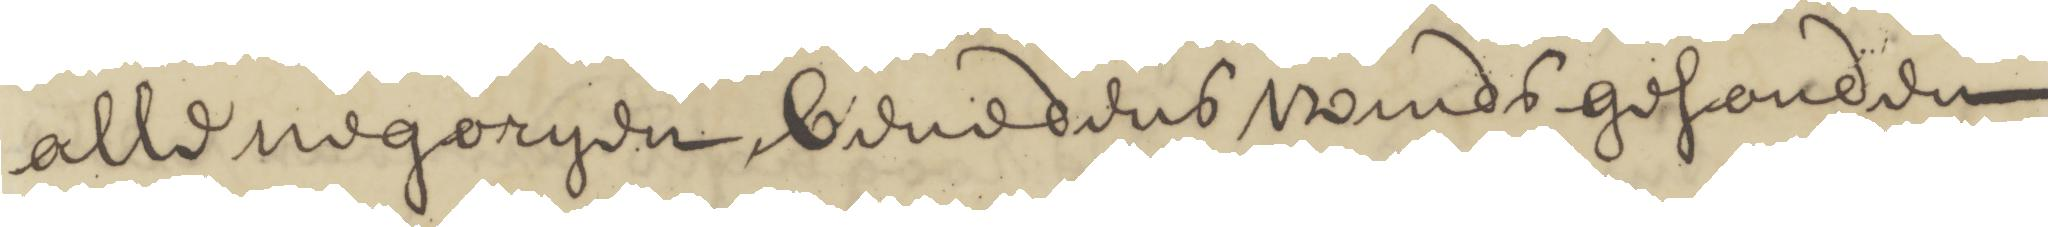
alle negoryen, benedens winds gesonden
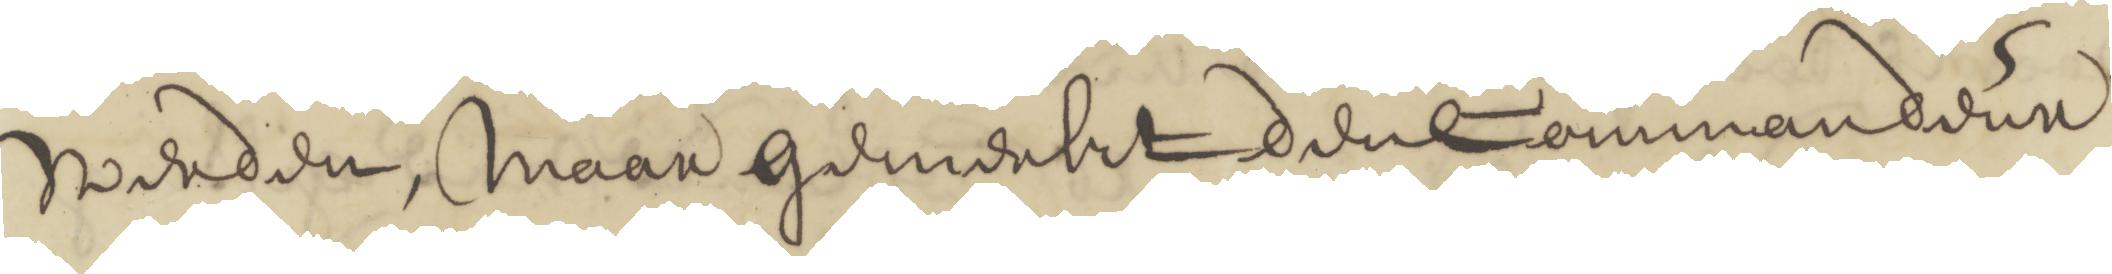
werden, maar gemerkt den Commandeur
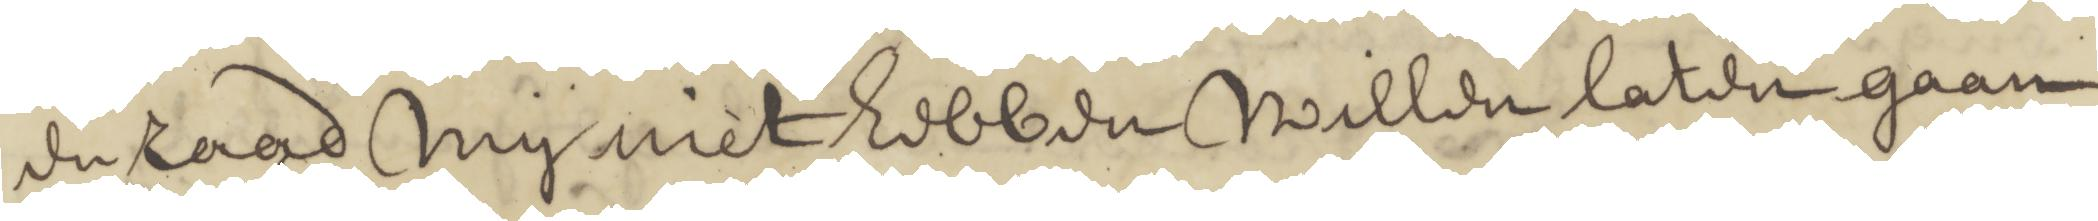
en raad mij niet hebben willen laten gaan
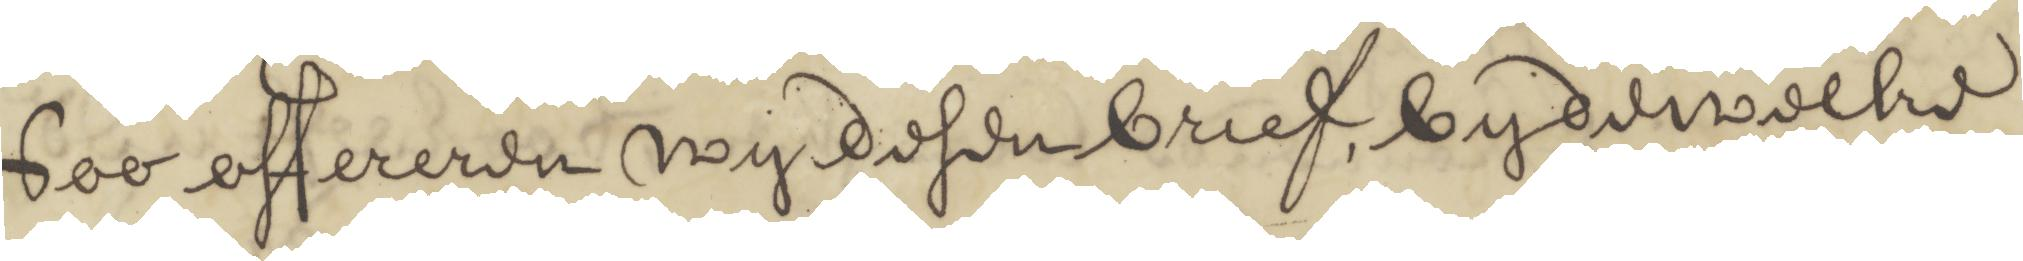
soo offereren wij desen brief, bij de welke
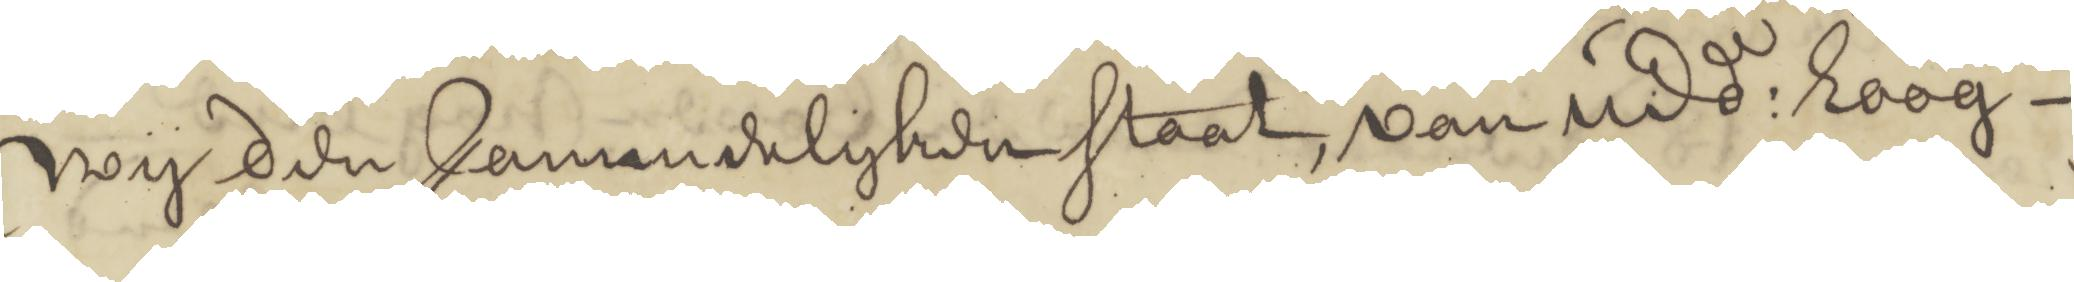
wij den jammerlijken staat, van uEd: hoog
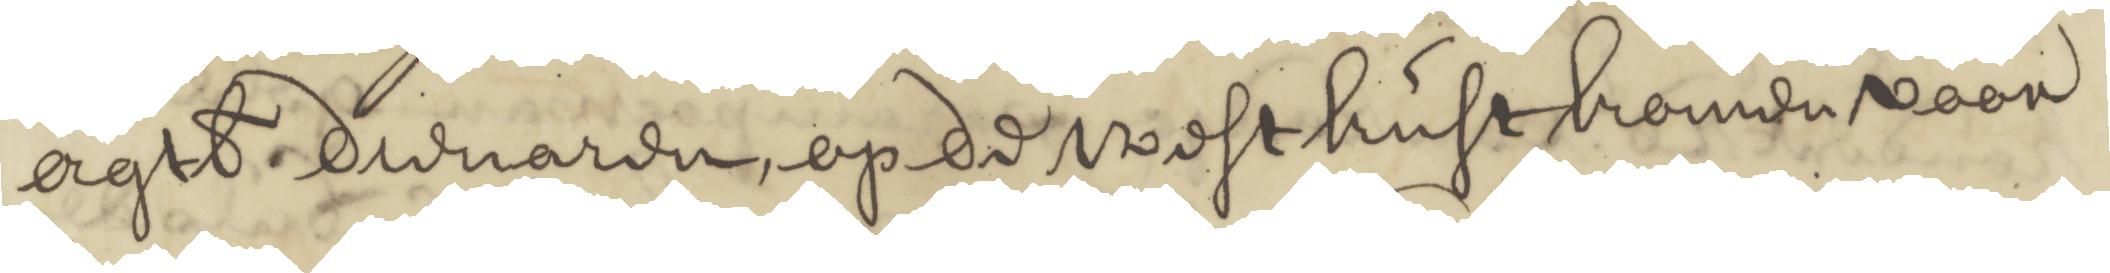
agtb dienaren, op de westkust komen voor
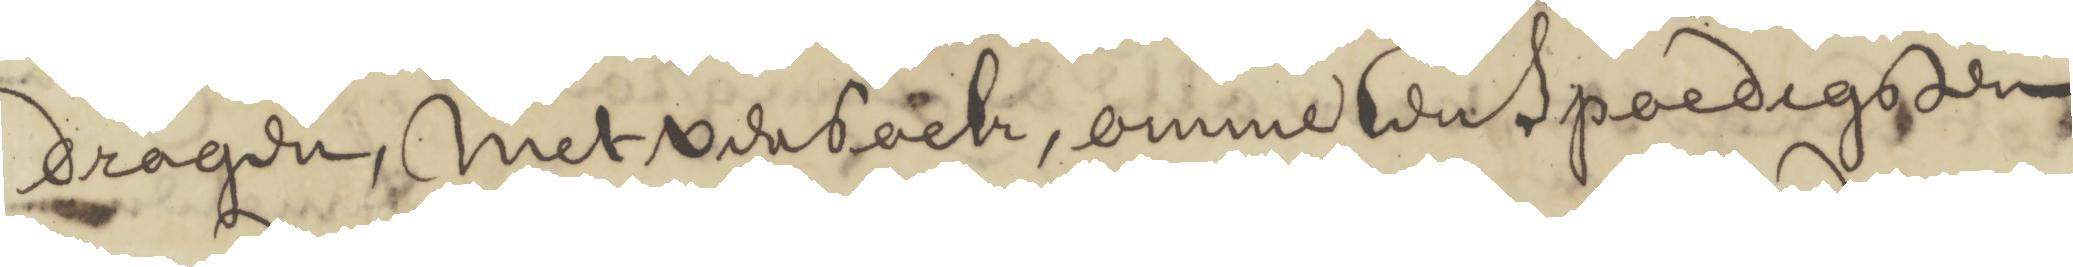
dragen, met versoek, omme ten spoedigsten
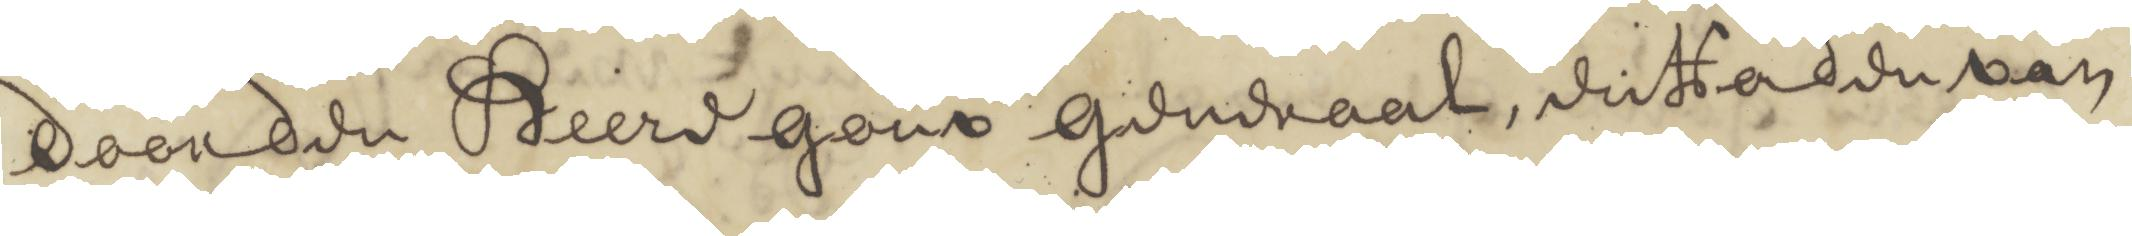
door den Heere gouvr generaal, en Raden van
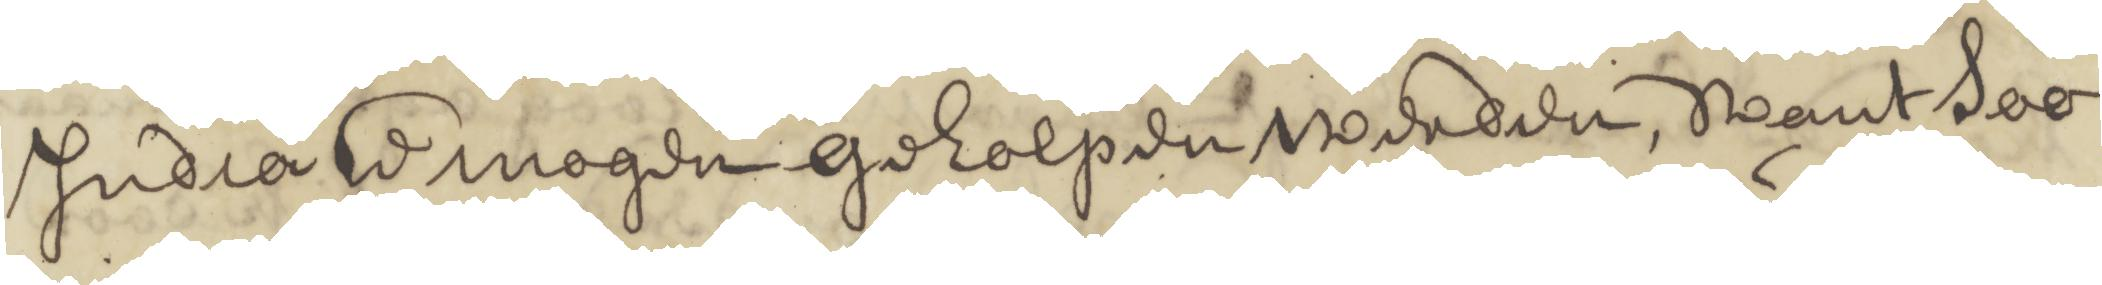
Jndia te mogen geholpen werden, want soo
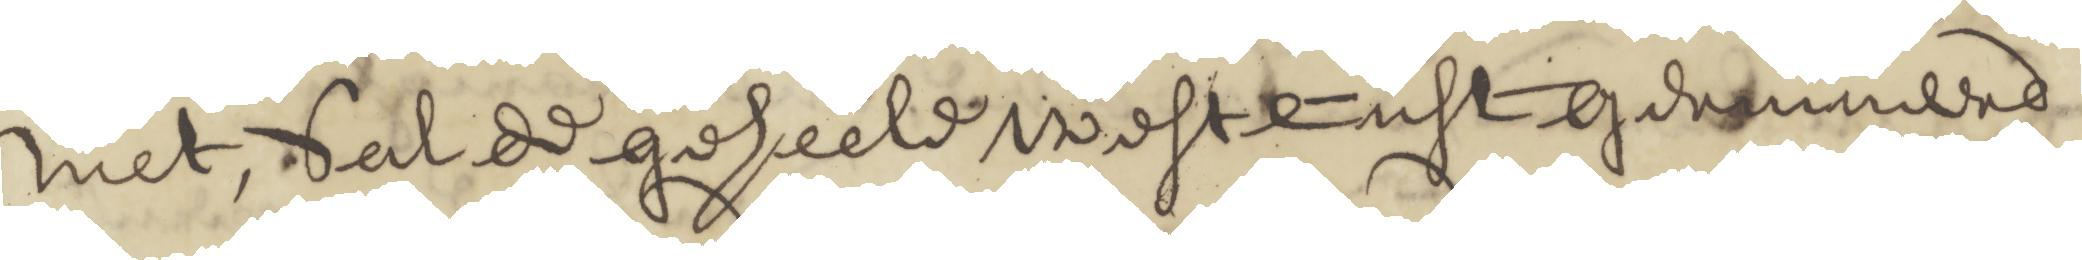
niet, sal de geheele westcust geruineerd
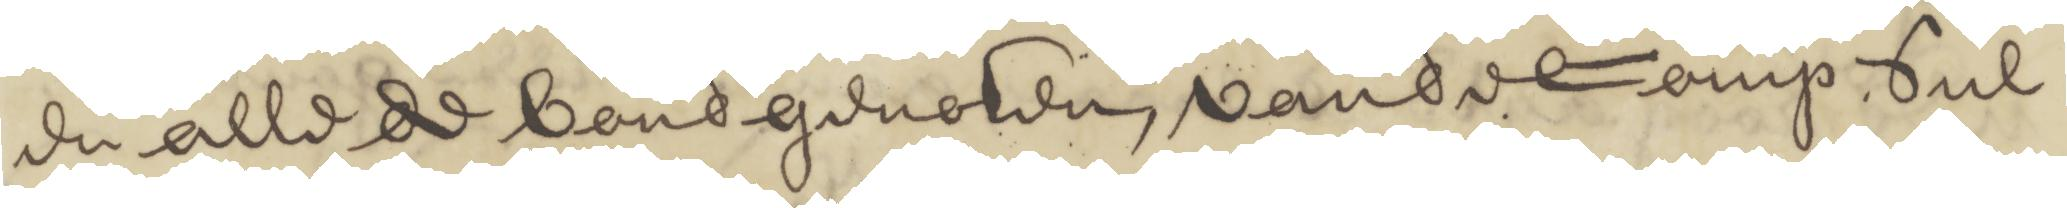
en alle de bondgenoten, van de Comp, sul
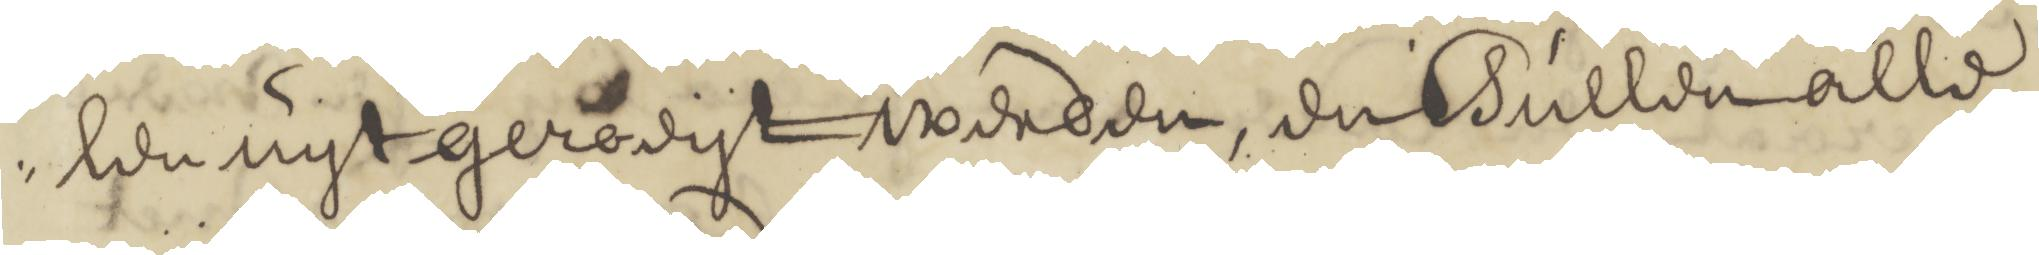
„len uijtgeroeijt werden, en ’t sullen alle
